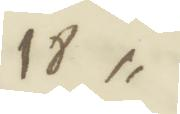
18 „
